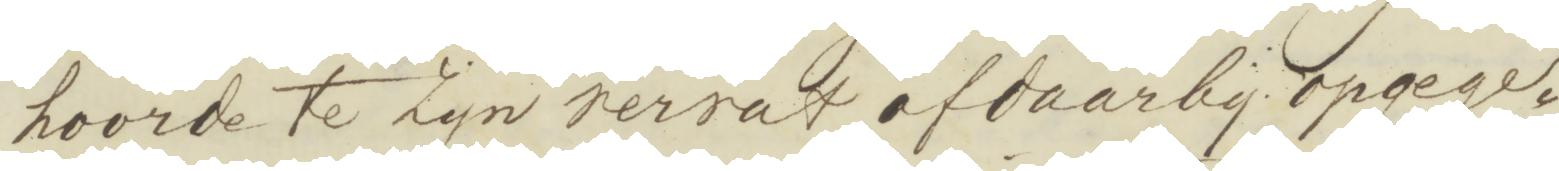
hoorde te zijn vervat of daarbij opgege
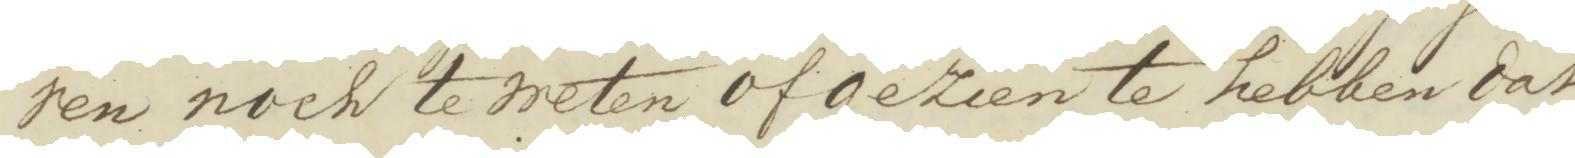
ven noch te weten of gezien te hebben dat
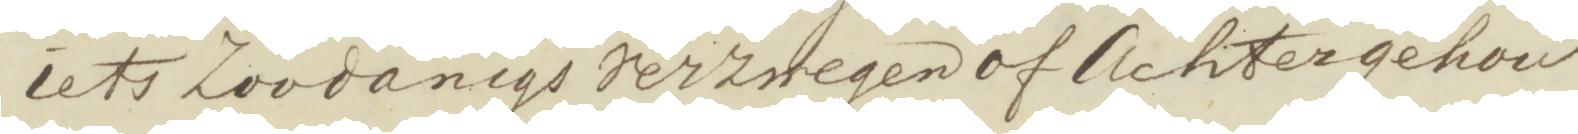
iets zoodanigs verzwegen of achtergehou
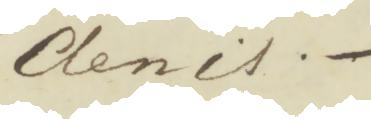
den is.—
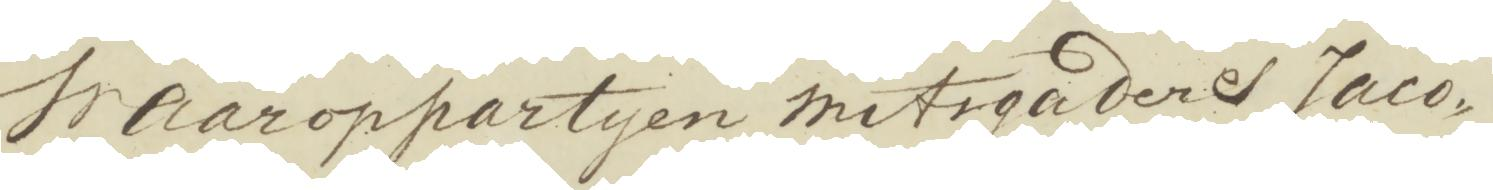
Waarop partyen mitsgaders Jaco„
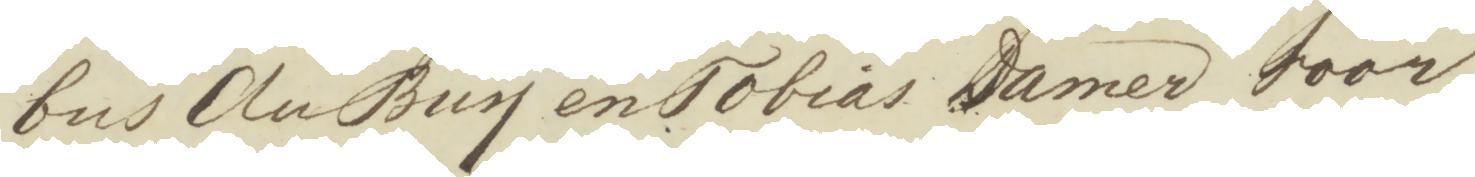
bus du Buy en Tobias Damer voor
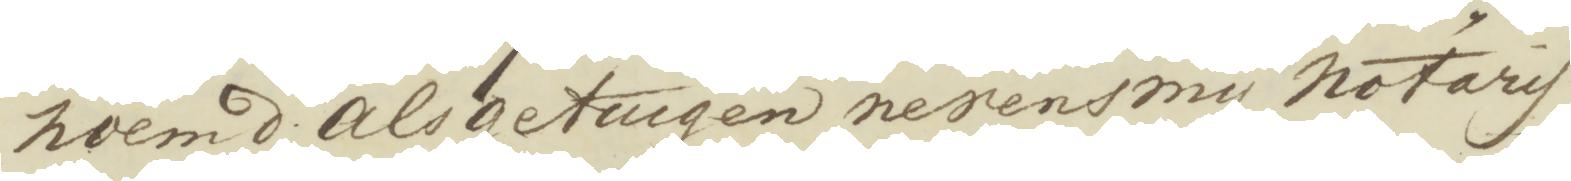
noemd als getuigen nevens mij notaris
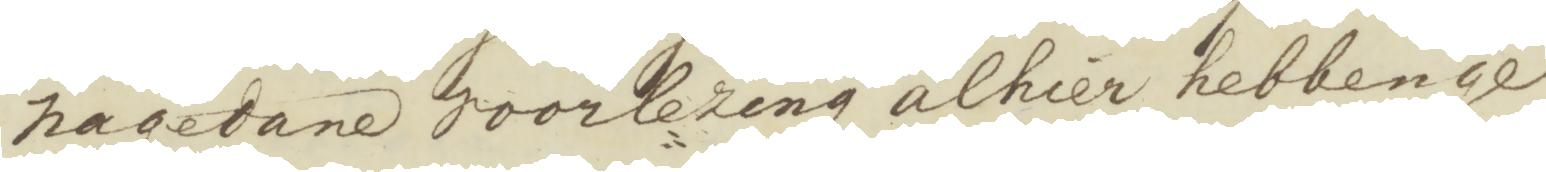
nagedane voorlezing alhier hebben ge
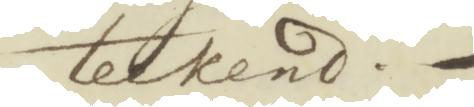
teekend.—
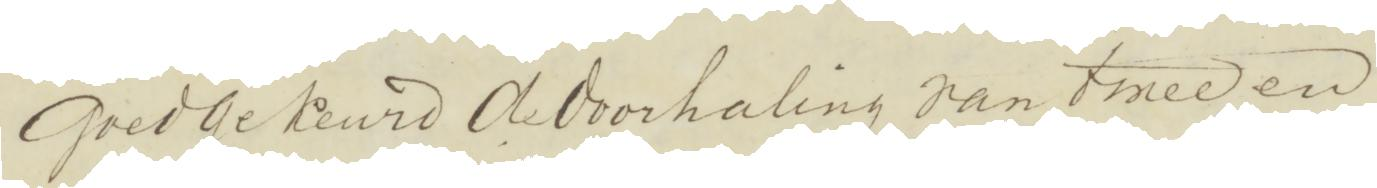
Goedgekeurd de doorhaling van twee en
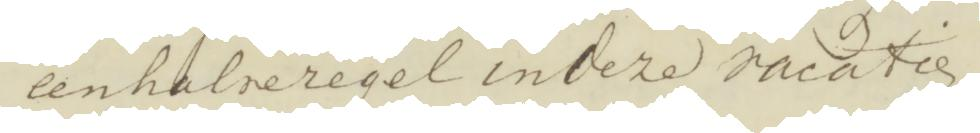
een halve regel in deze vacatie
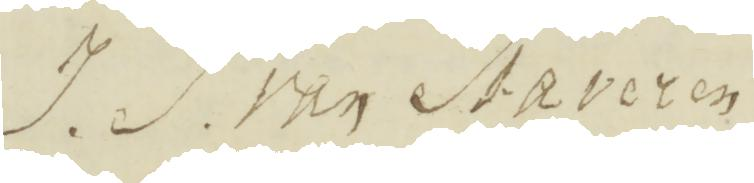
I. S. van Staveren
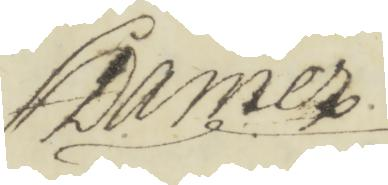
Damer
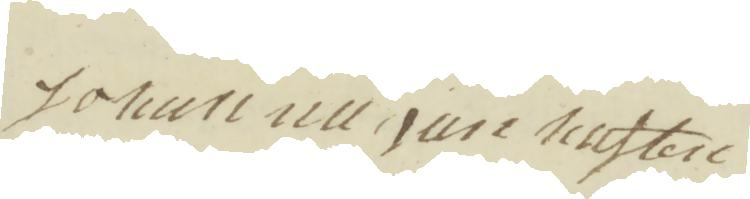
Johan nes van haften
